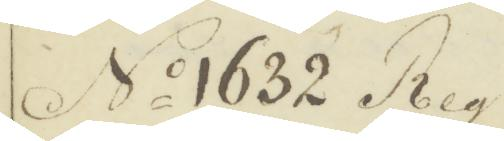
N:o 1632 Reg
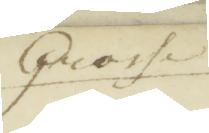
Grosse
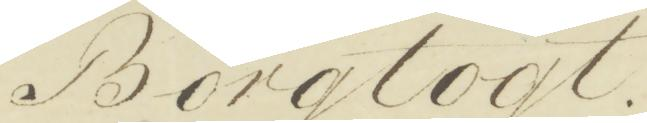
Borgtogt.
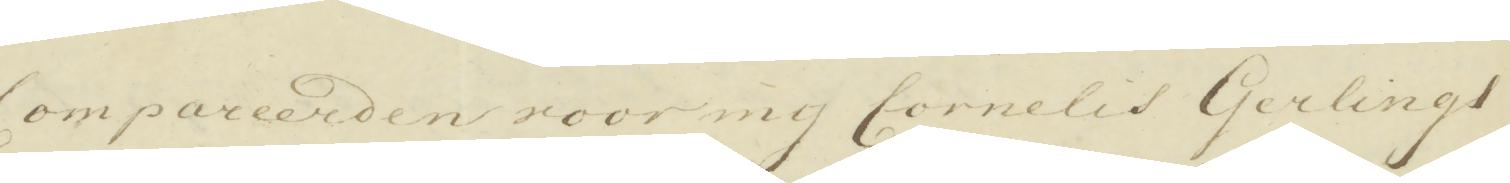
Compareerden voor mij Cornelis Gerlings
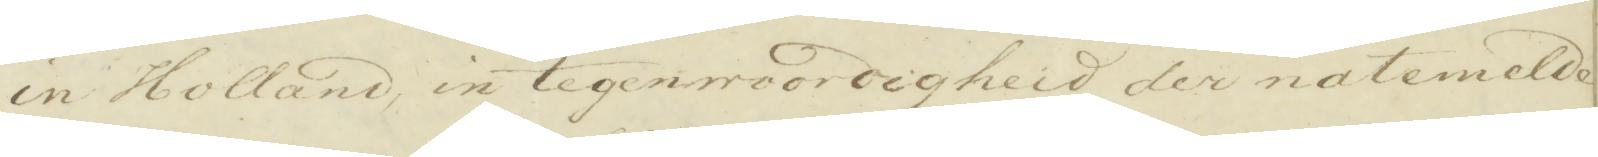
in Holland, in tegenwoordigheid der natemelde
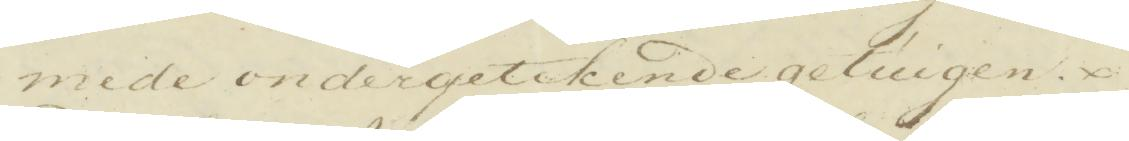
mede ondergetekende getuigen.
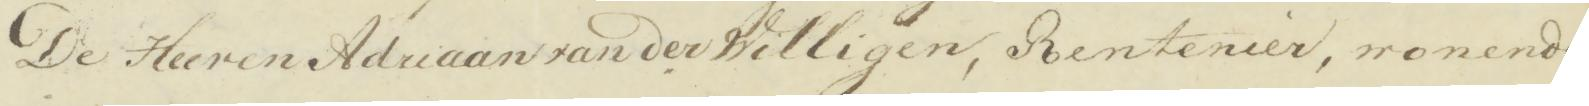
De Heeren Adriaan van der Willigen, Rentenier, wonende
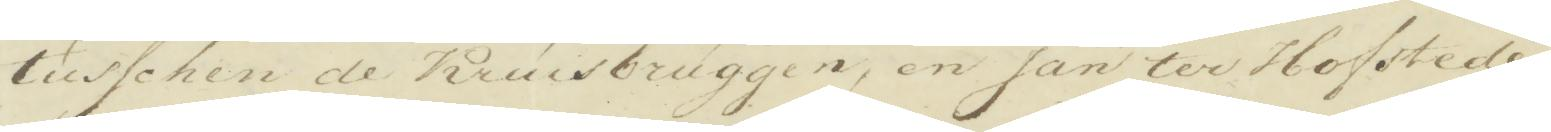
tusschen de Kruisbruggen, en Jan ter Hofstede
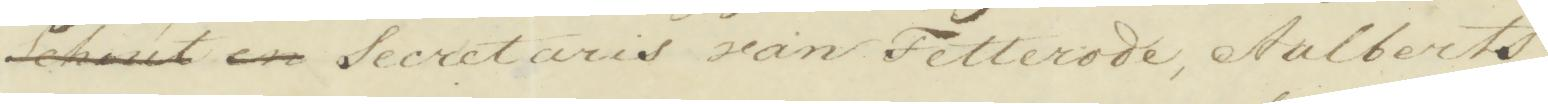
schout en Secretaris van Tetterode, Aalberts
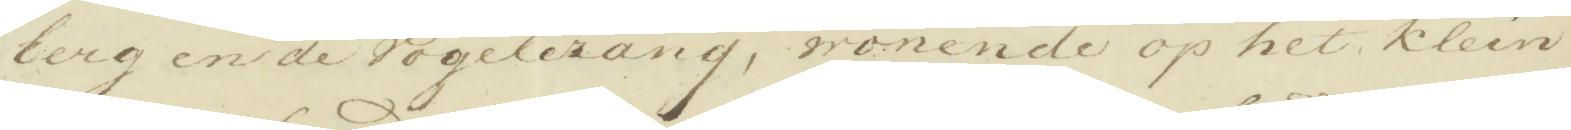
berg en de Vogelezang, wonende op het klein
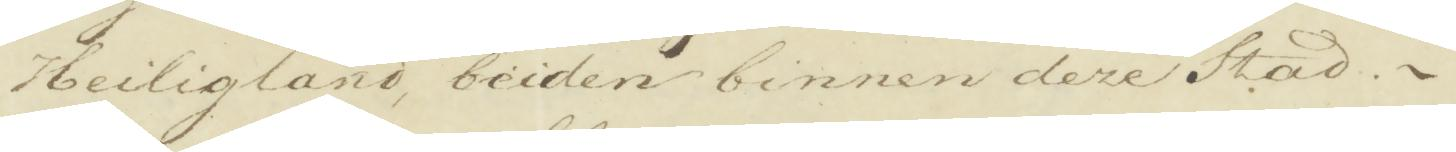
Heiligland, beiden binnen deze stad.
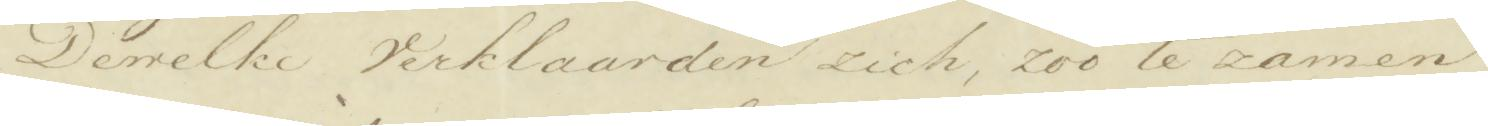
Dewelke verklaarden zich, zoo te zamen
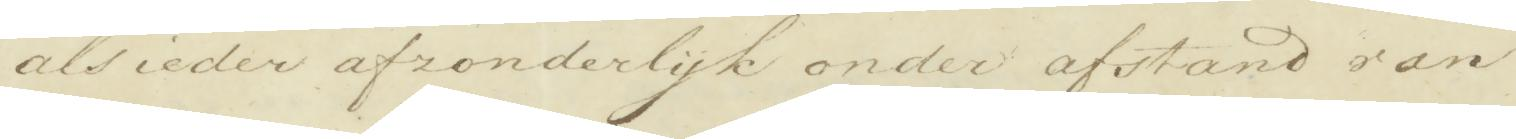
als ieder afzonderlijk onder afstand van
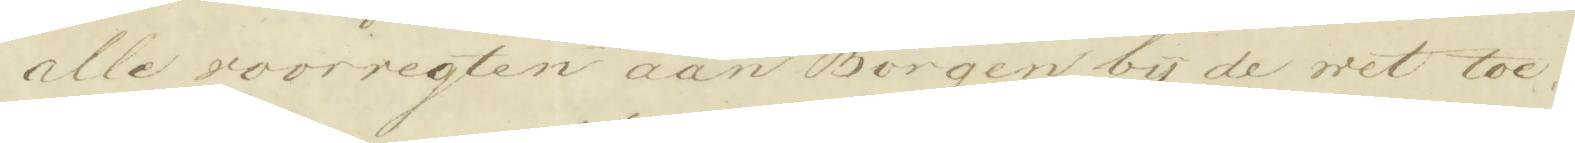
alle voorregten aan Borgen bij de wet toe„
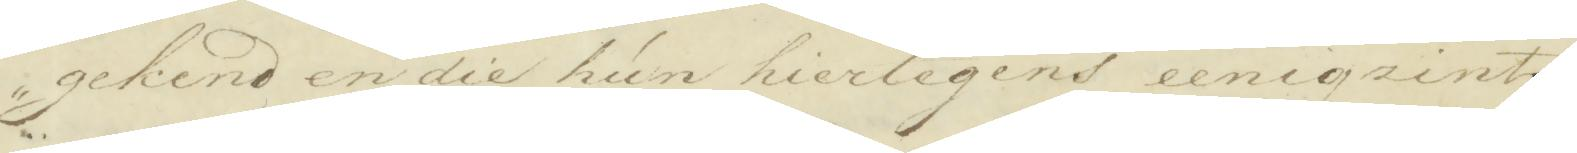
„gekend en die hun hiertegens eenigzints
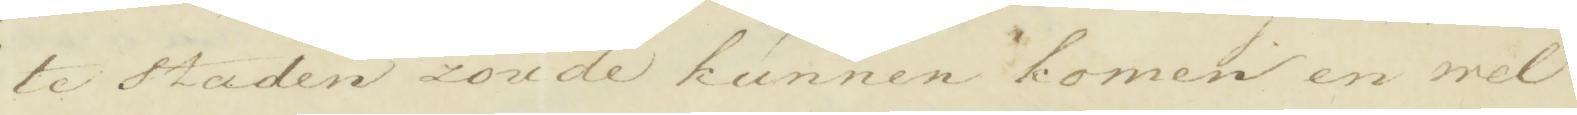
te staden zoude kunnen komen en wel
